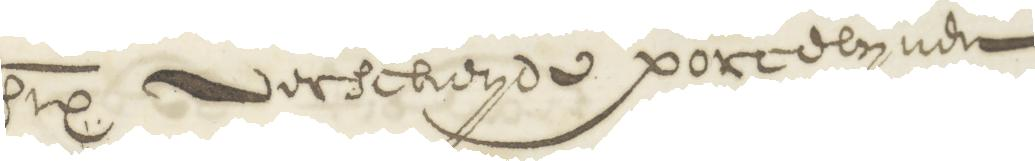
stx verscheyde porcelynen
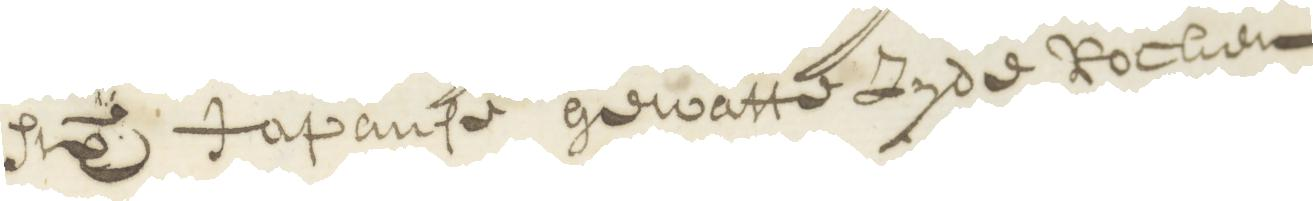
stx Japanse gewatte zyde Rocken
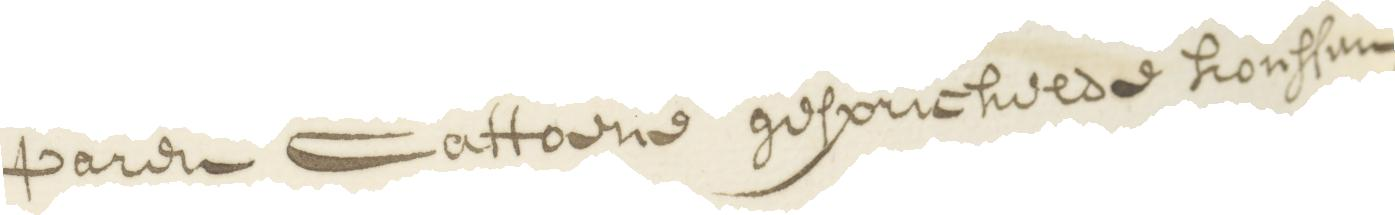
paren cattoene gesprickelde koussen
